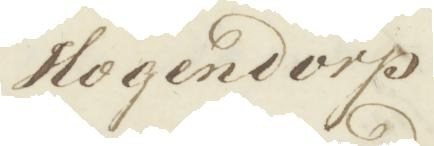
Hogendorp
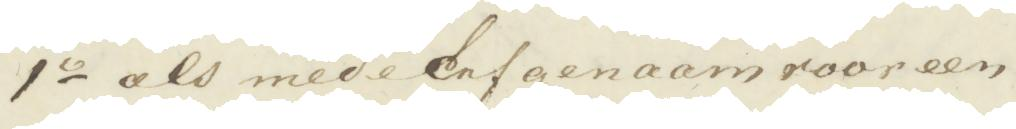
1-o als mede Erfgenaam voor een
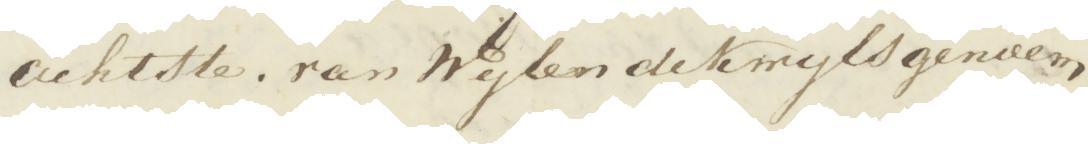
achtste, van Wylen dikwyls genoem
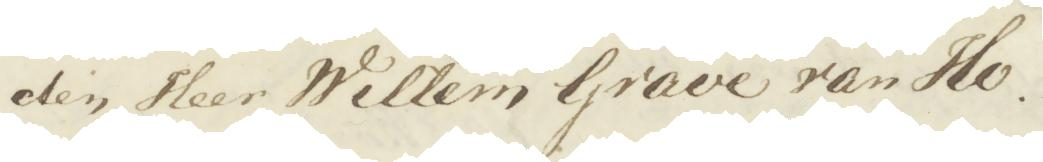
den Heer Willem Grave van Ho.
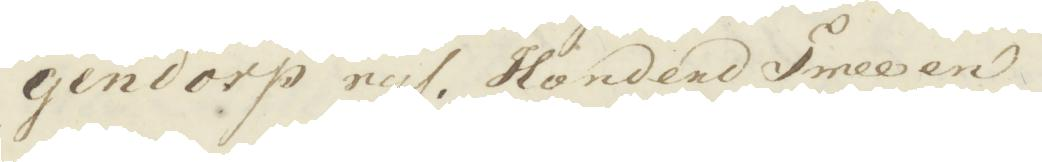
gendorp vyf. Honderd Twee en
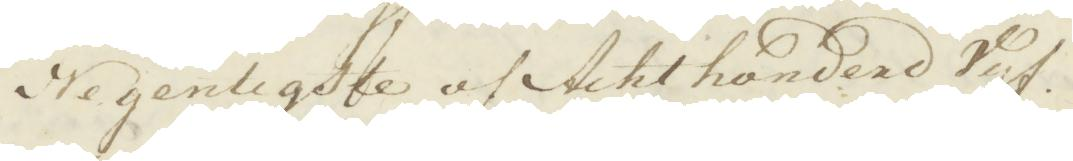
Negentigste of Achthonderd Vyf.
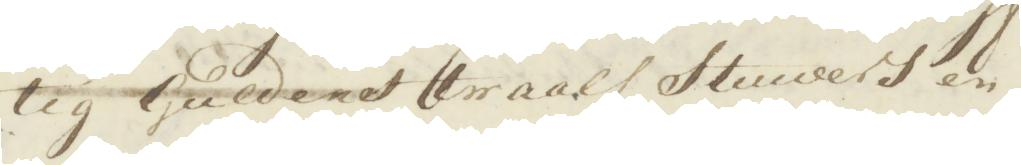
tig Guldens twaalf Stuivers en
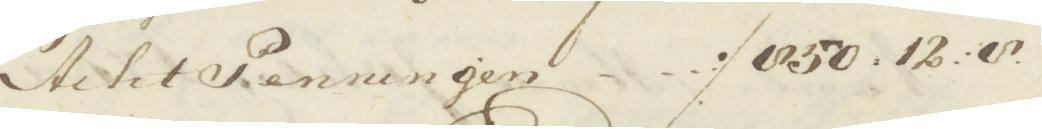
Acht Penningen - - - - ƒ 850: 12: 8.
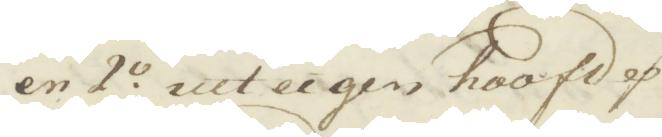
en 2.o uit eigen hoofd of
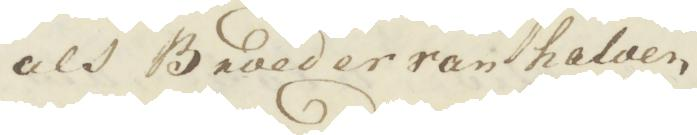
als Broeder van halven
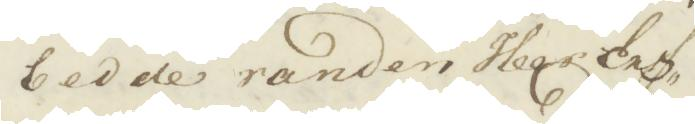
bedde van den Heer Erf„
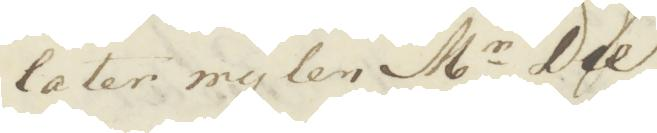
later wylen M-r Die
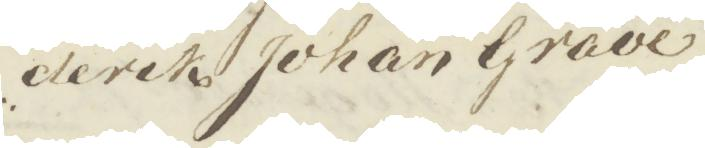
,derik Johan Grave
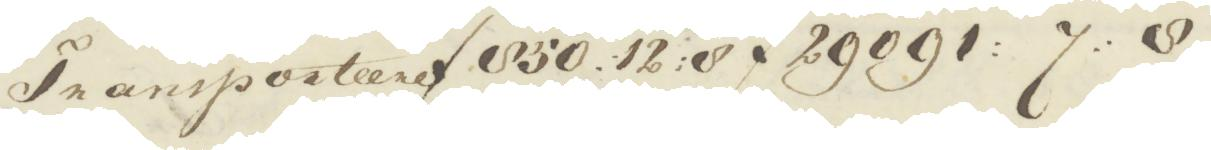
Transporteere ƒ 850: 12: 8 ƒ 29091: 7: 8
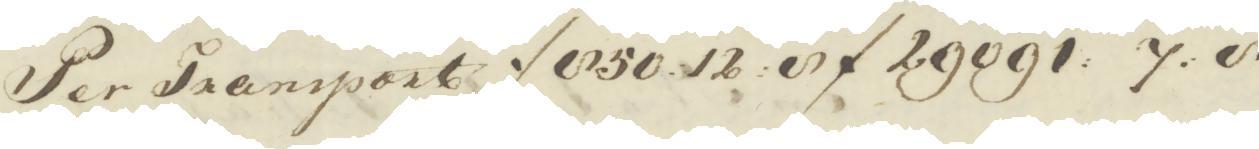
Per Transport ƒ 850: 12: 8 ƒ 29091: 7: 8
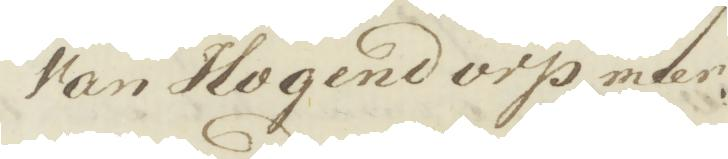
Van Hogendorp meer
